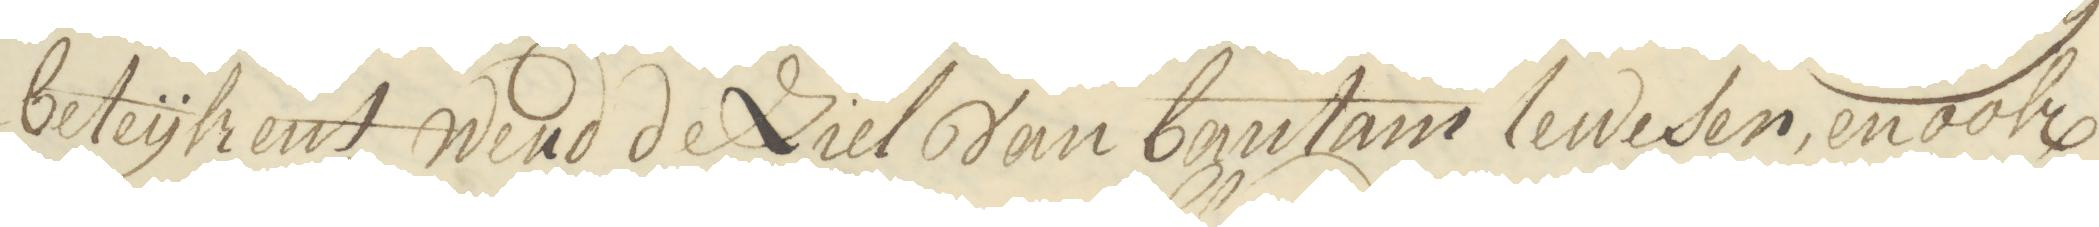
beteijkent werd de ziel van bantam te wesen, en ook
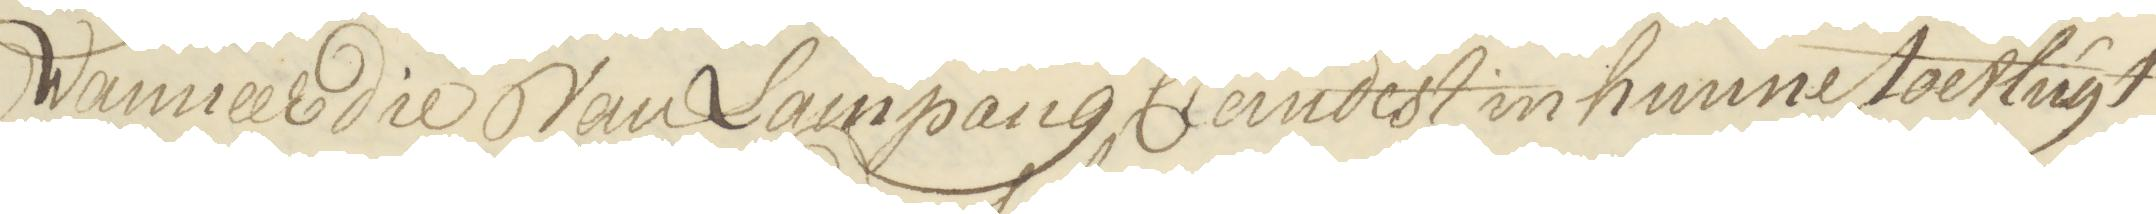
wanneer die van Lampong Clandest in hunne toevlugt
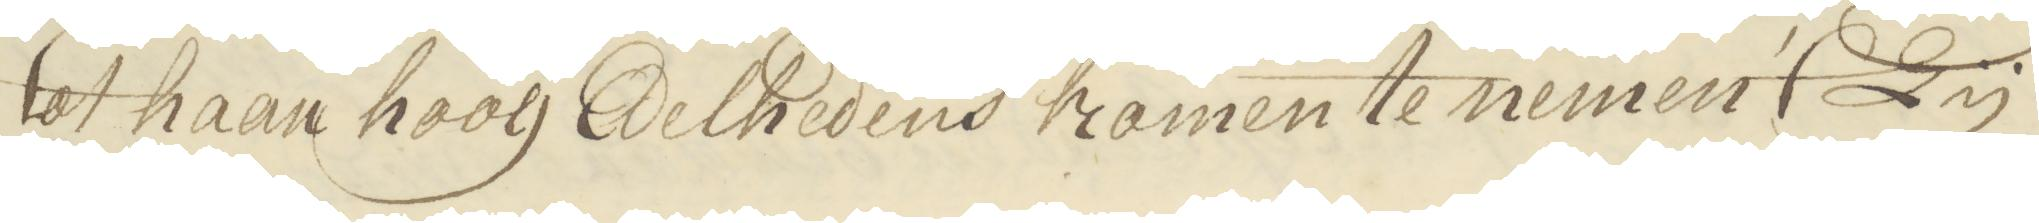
tot haar hoog Edelhedens komen te nemen 't zij
